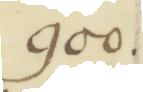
900.
